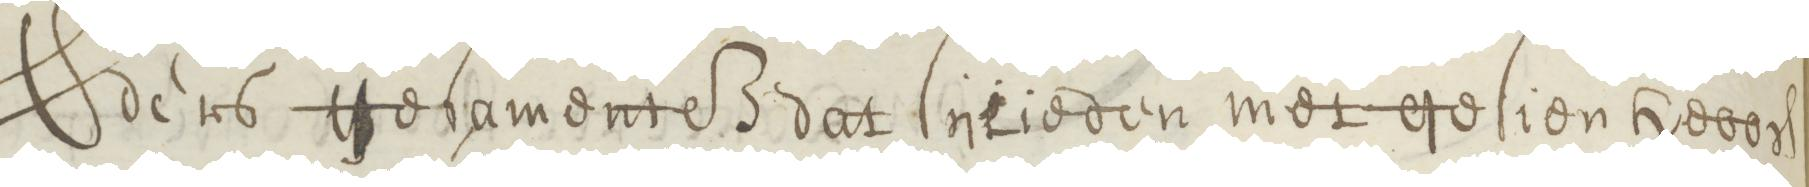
Verders thesamentlijk dat sijlieden niet gesien hebbens
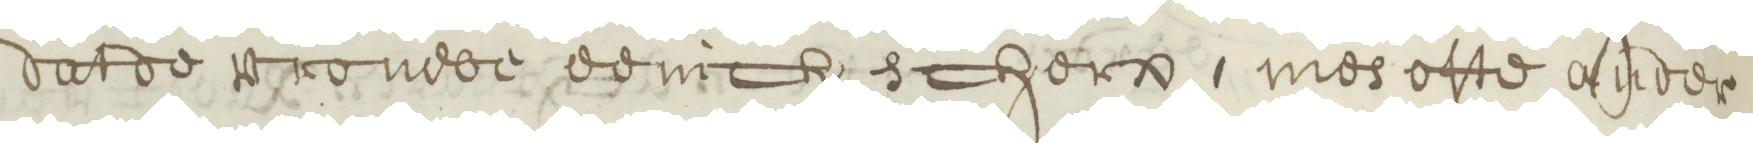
dat de vrouwe eenich scherp, mes ofte ander
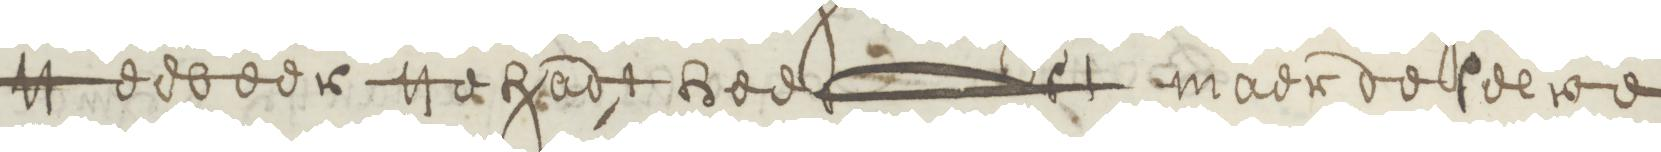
geebder gehadt heeft maer deselve
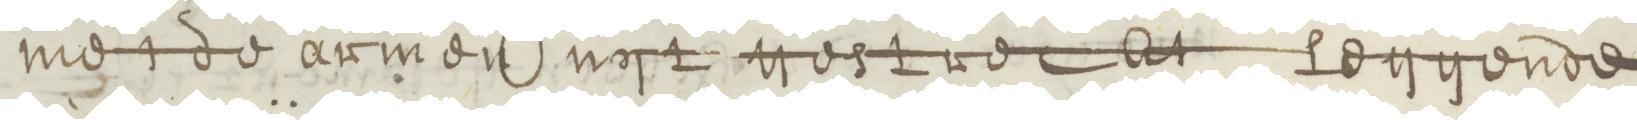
met de armen uyt gestreckt leggende
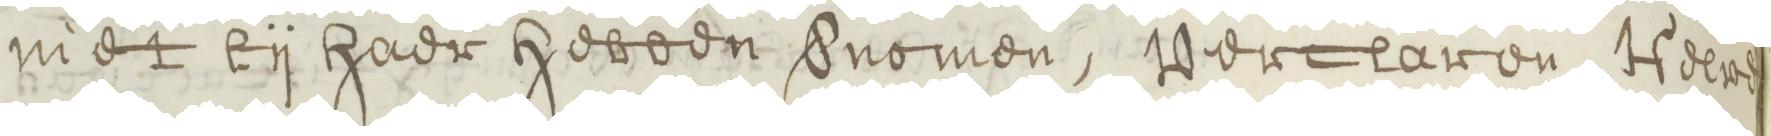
niet bij haer hebben vernomen, verclaren tselven
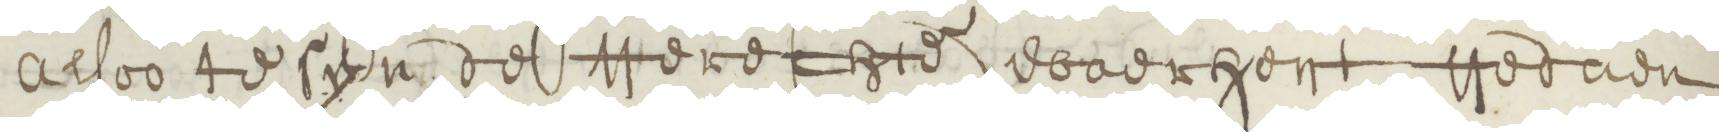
alsoo te syn, de gerechte waerheit gedaen
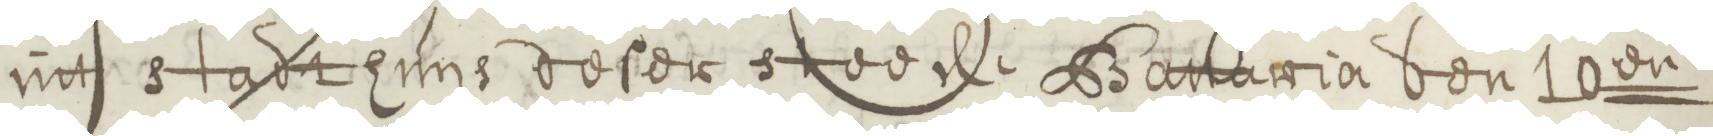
int stadthuys deser steede Battavia den 10=en
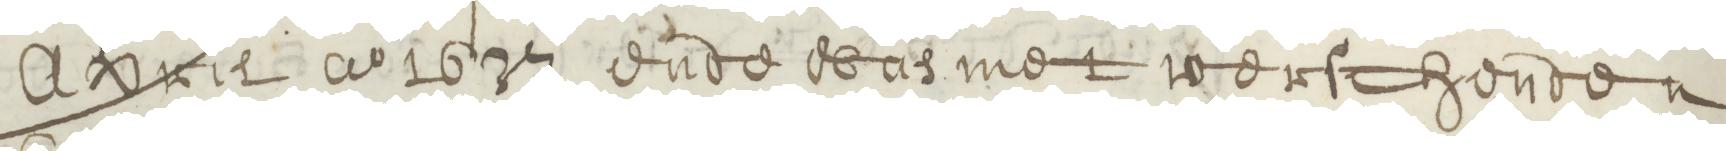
April ao 1637 ende was met verscheiden
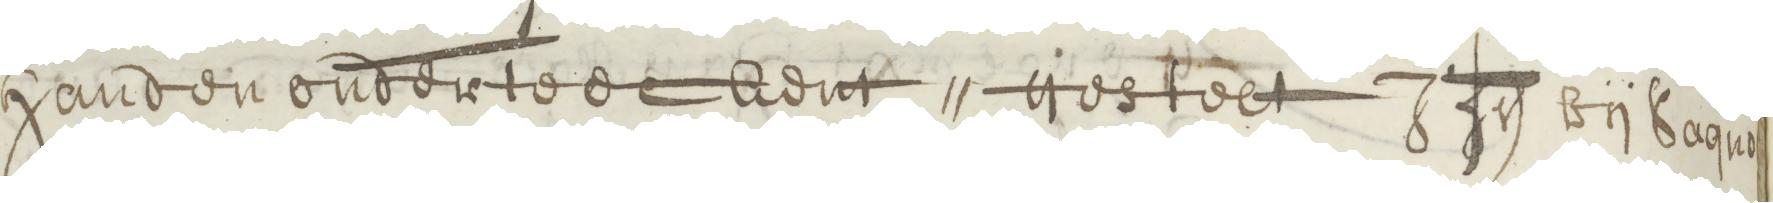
handen onderteeckent „ gestelt 7 frj bij daquo
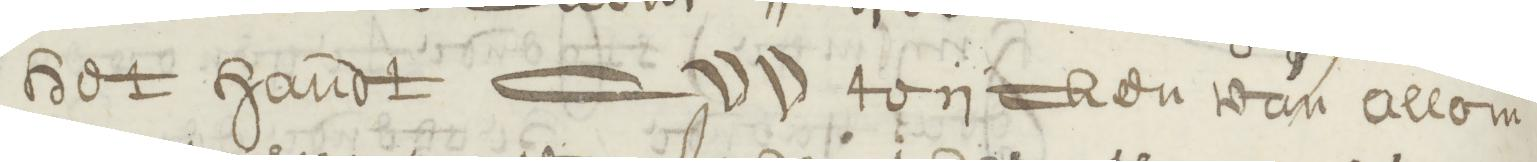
het handt C V V teijchen van allom
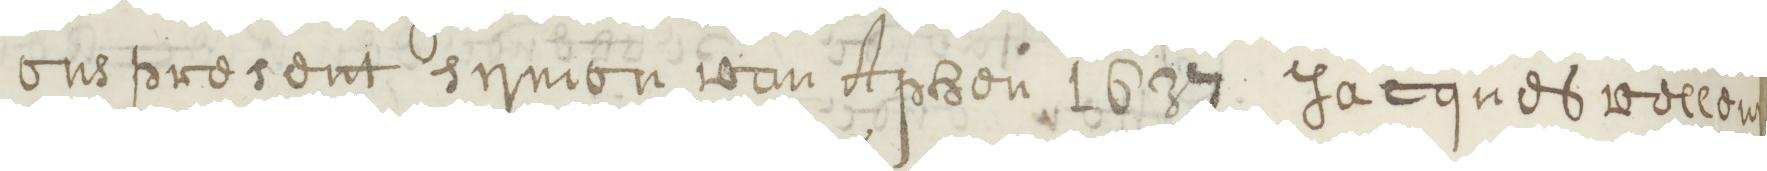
ons present symon van Aphen 1637 Jacques vellen
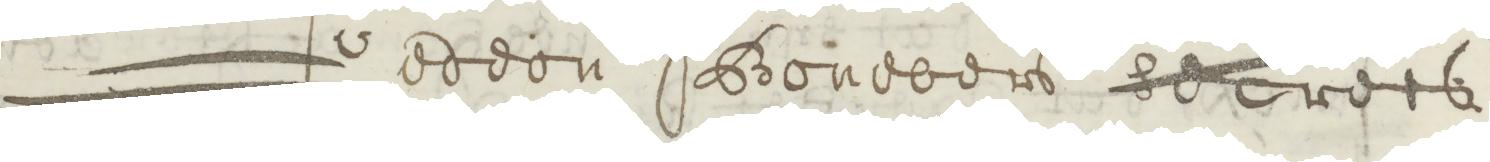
Geddon Bonebers secrets.
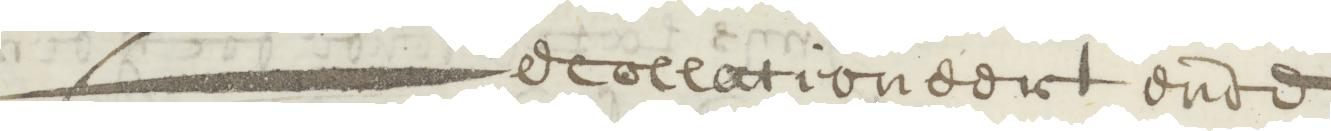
Gecollationeert ende
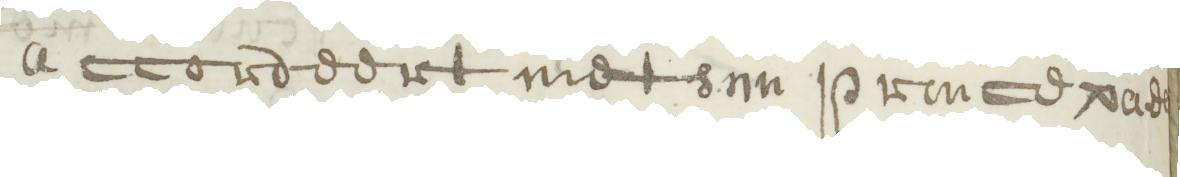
accordeert met sijn princepae
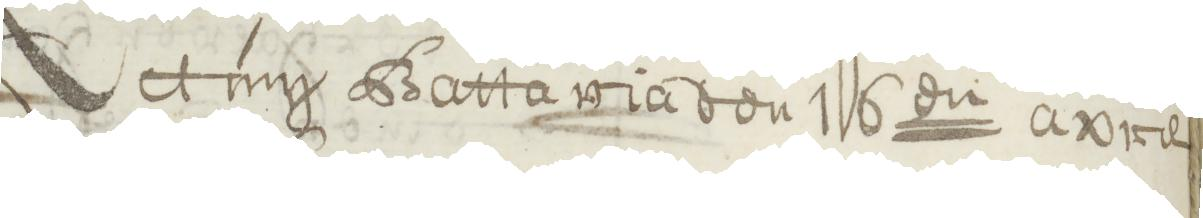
Actum Battavia den 16=en april
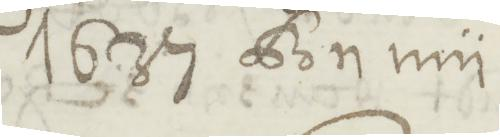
1637 By mij
